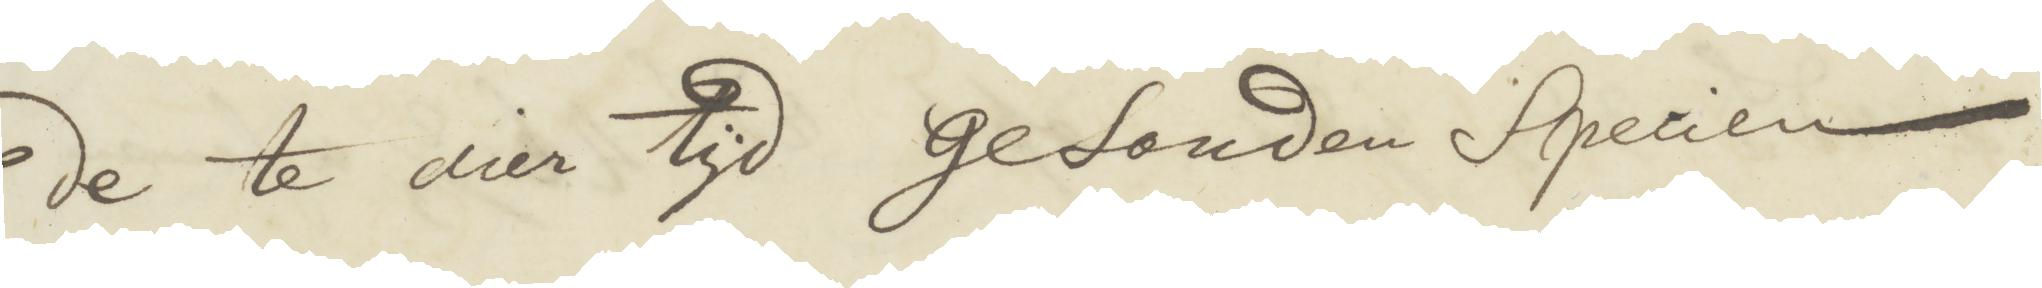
de te dier tijd gesonden specien
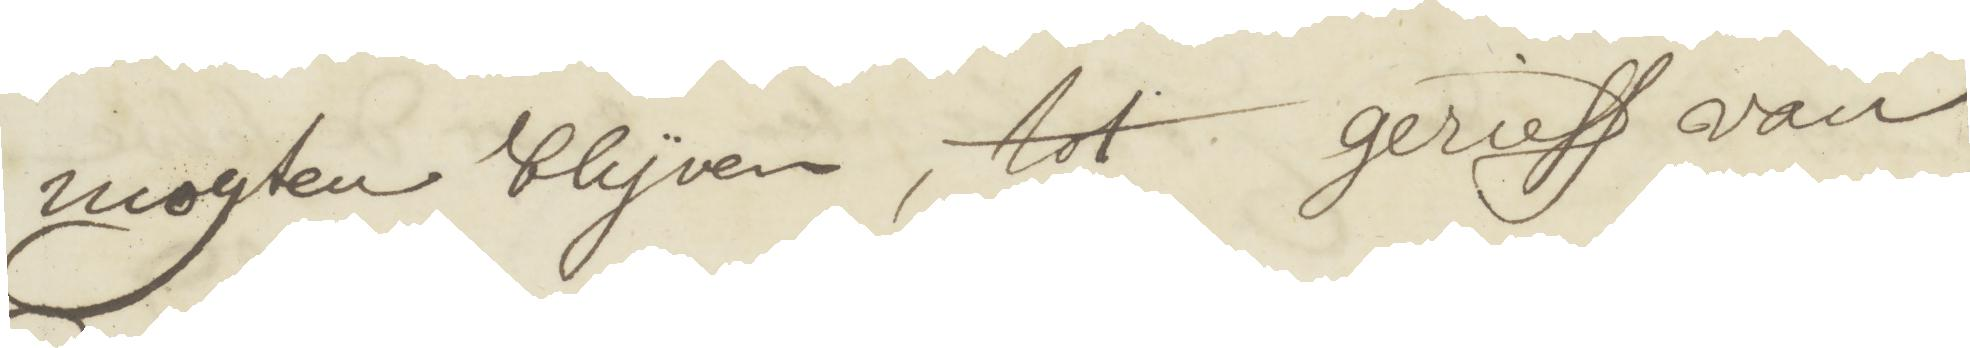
mogten blijven, tot gerieff van
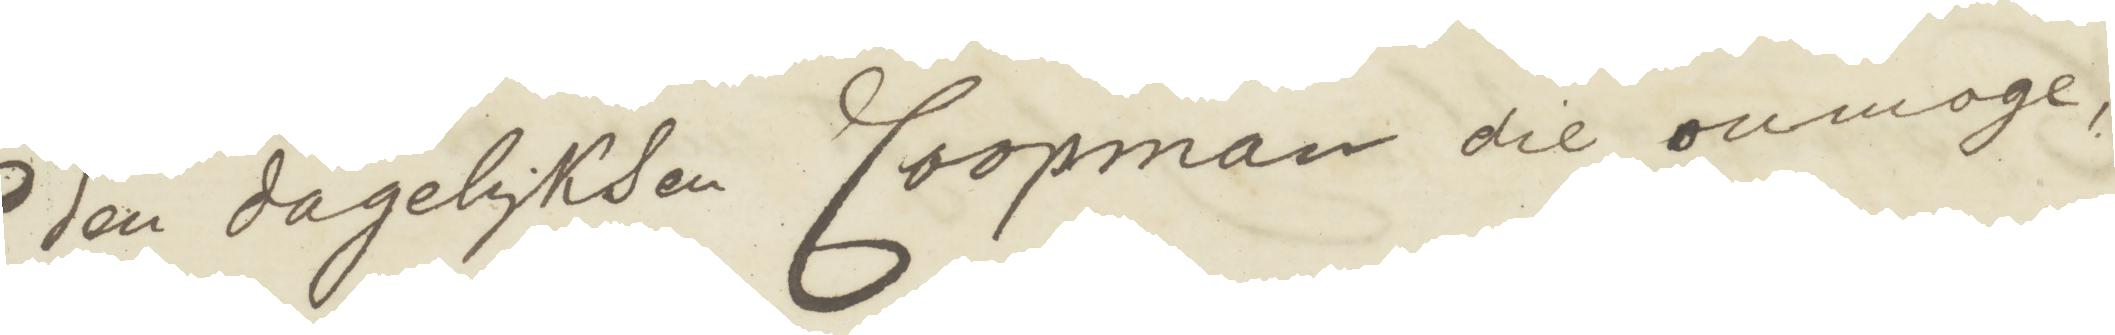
den dagelijksen Coopman die onmoge„
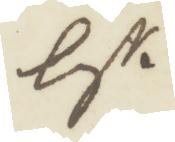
lyk.
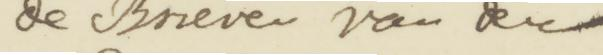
de Brieven van der
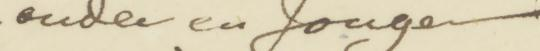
ouden en Jongen
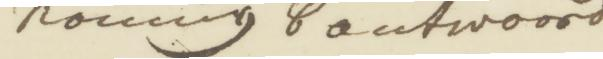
koning bantwoord
